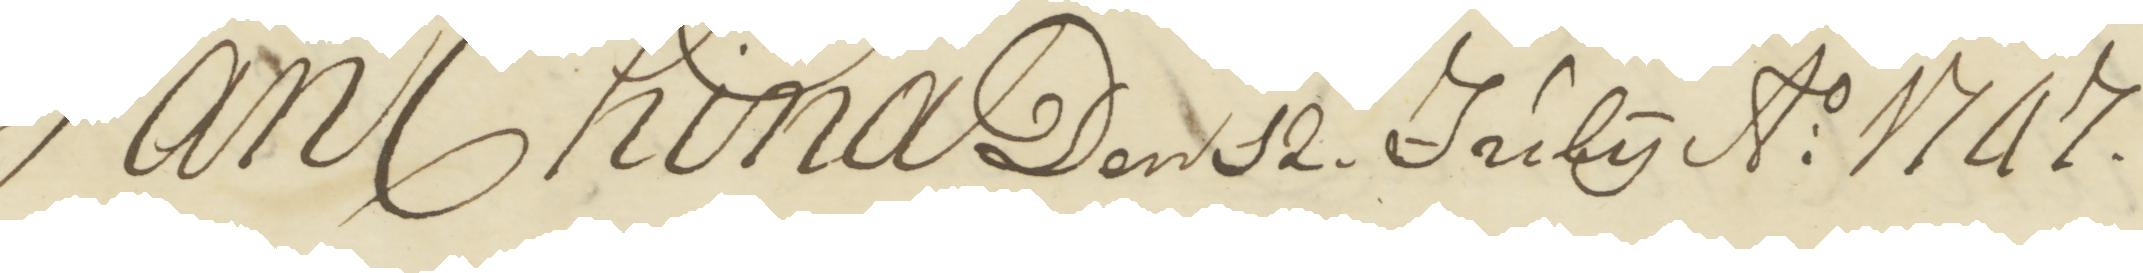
Van China Den 12.' Julij A:o 1747.
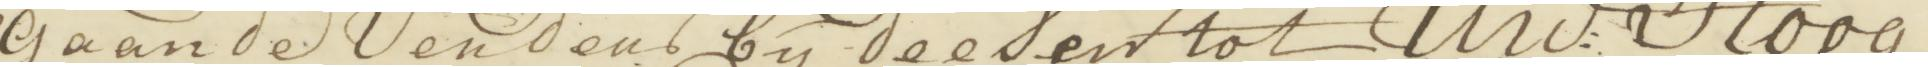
gaande verders by deesen tot uw: Hoog
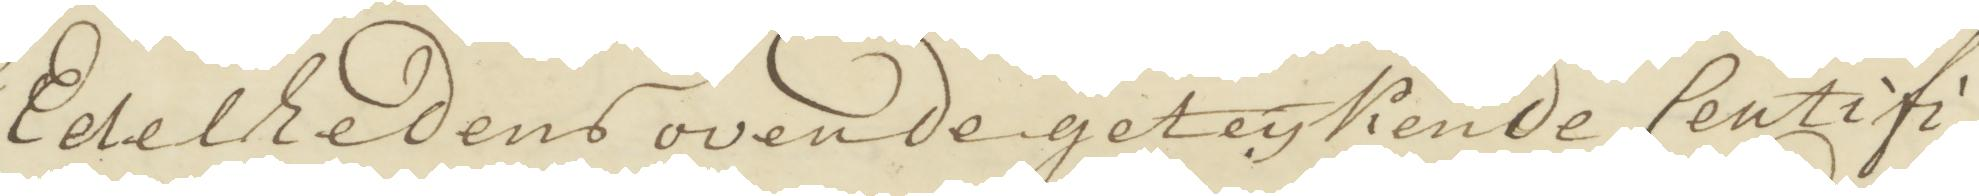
Edelhedens over de geteijkende Certifi
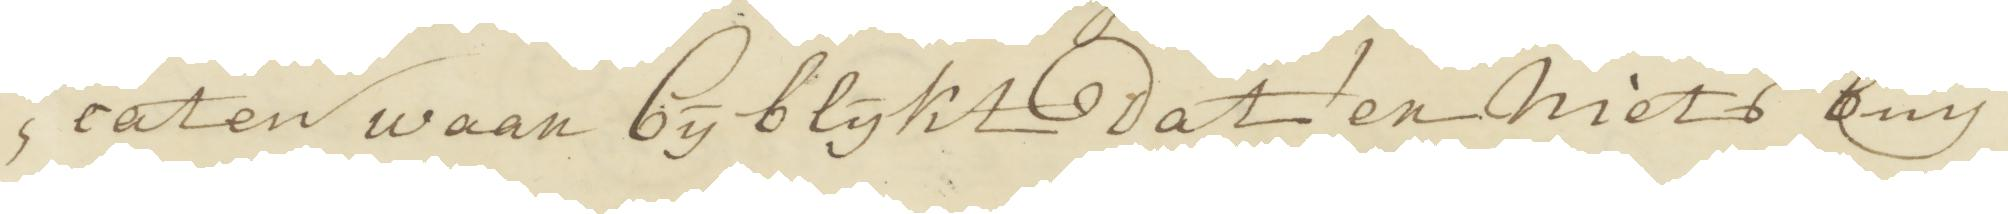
„caten waar bij blijkt dat 'er niets buij
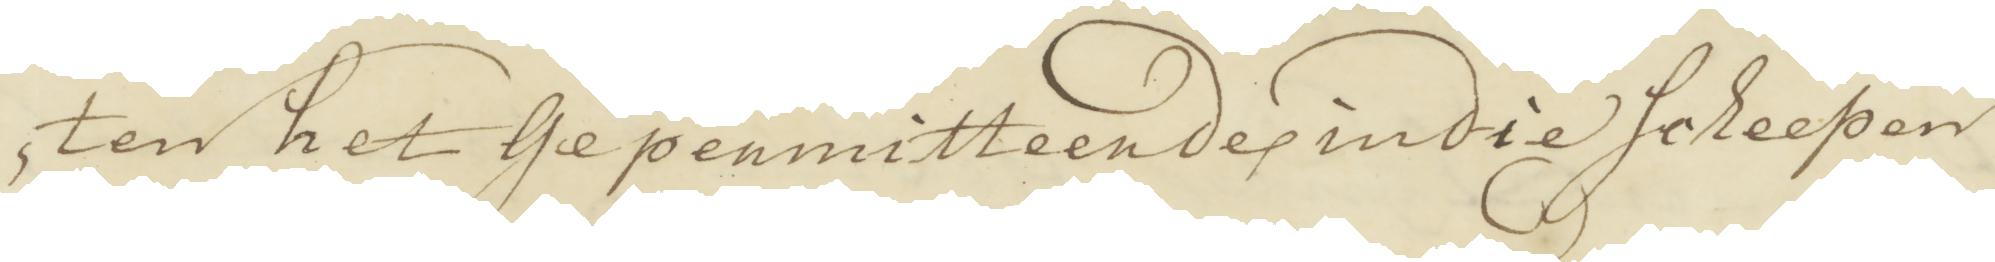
„ten het gepermitteerde in die scheepen
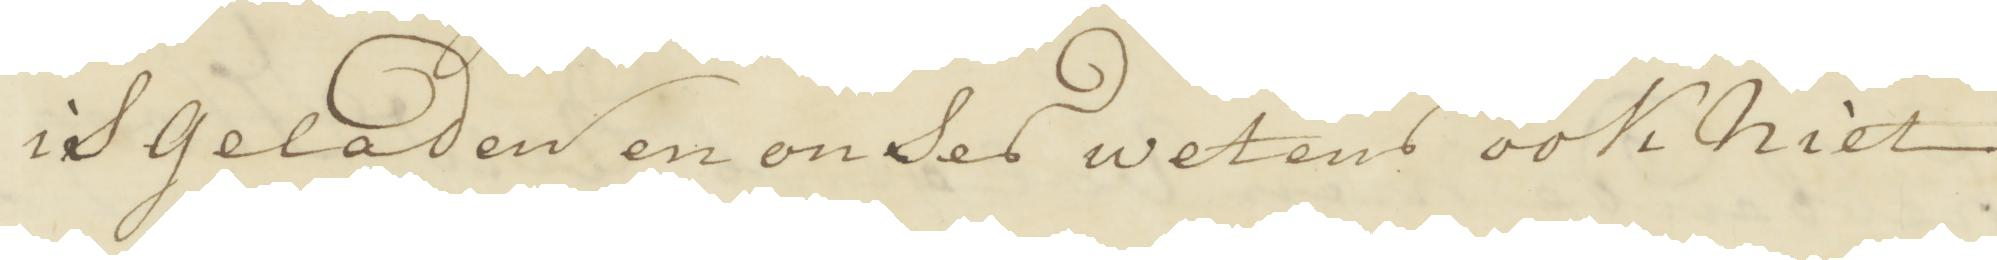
is geladen en onses wetens ook niet
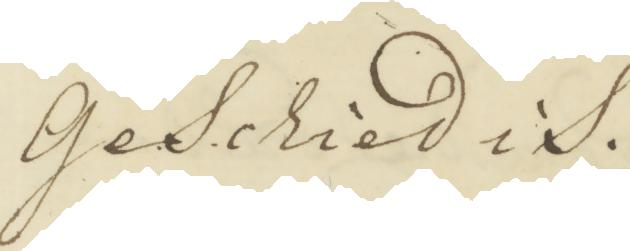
geschied is.
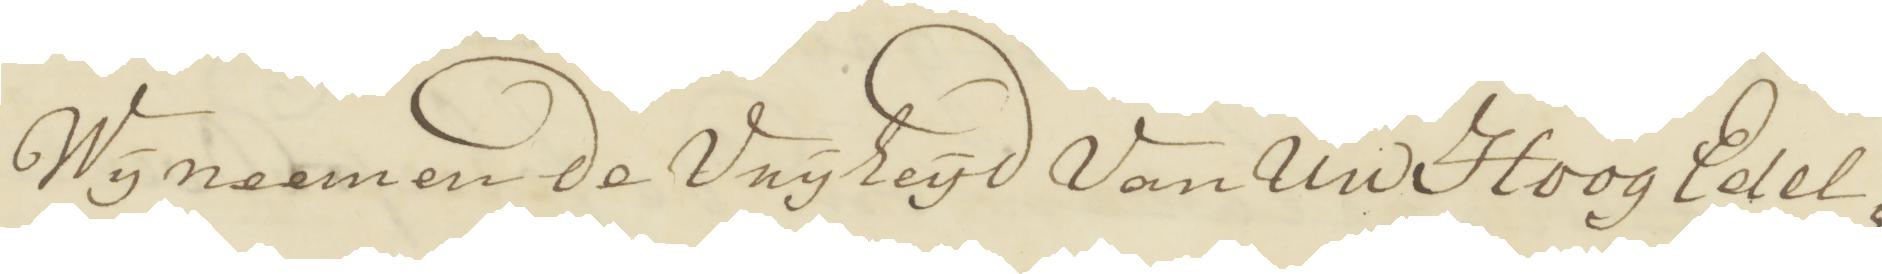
Wij neemen de vrijheijd van uw Hoog Edel„
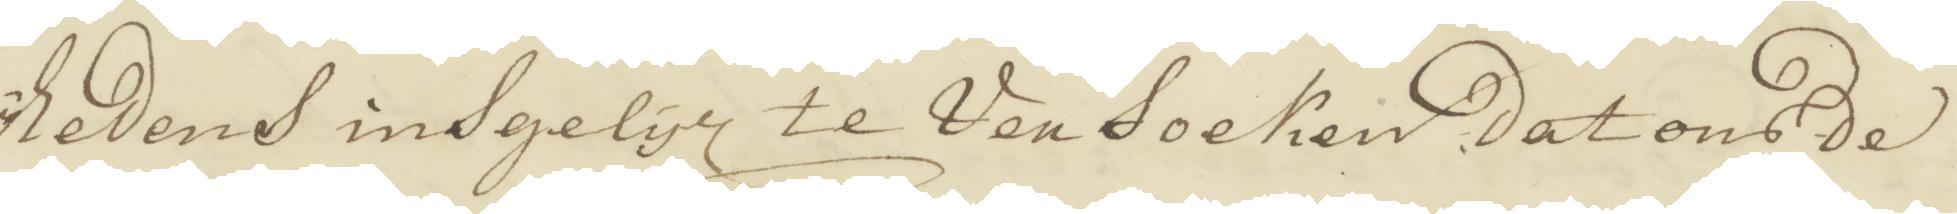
hedens insgelijx te versoeken dat ons de
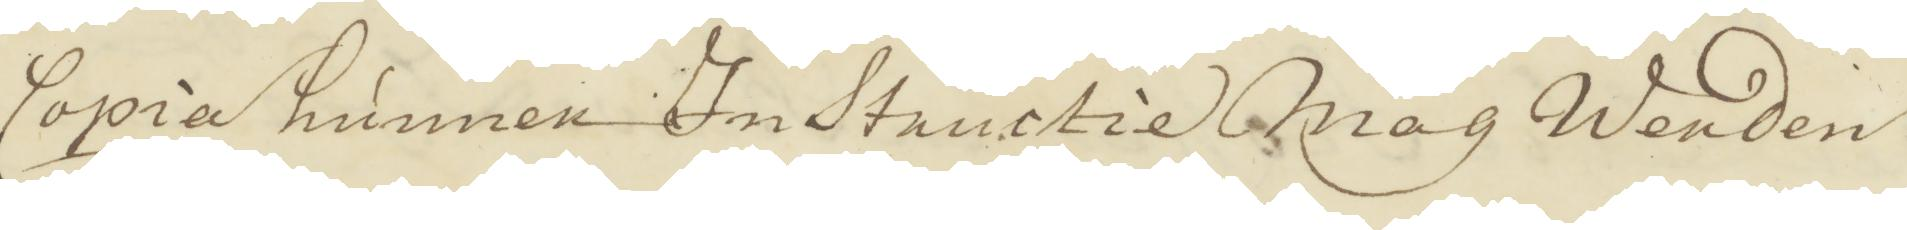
Copia hunnen Jnstructie mag werden
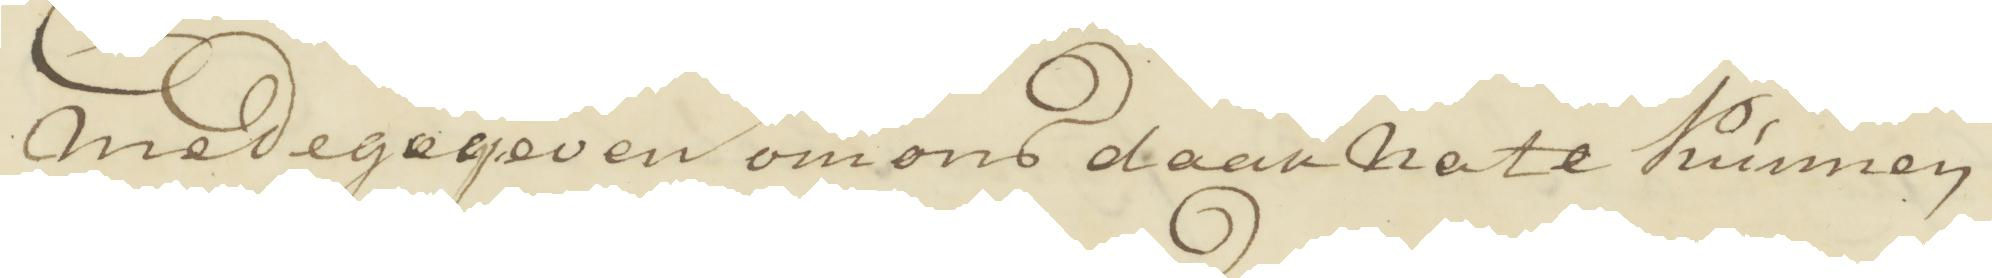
medegegeven om ons daar na te kunnen
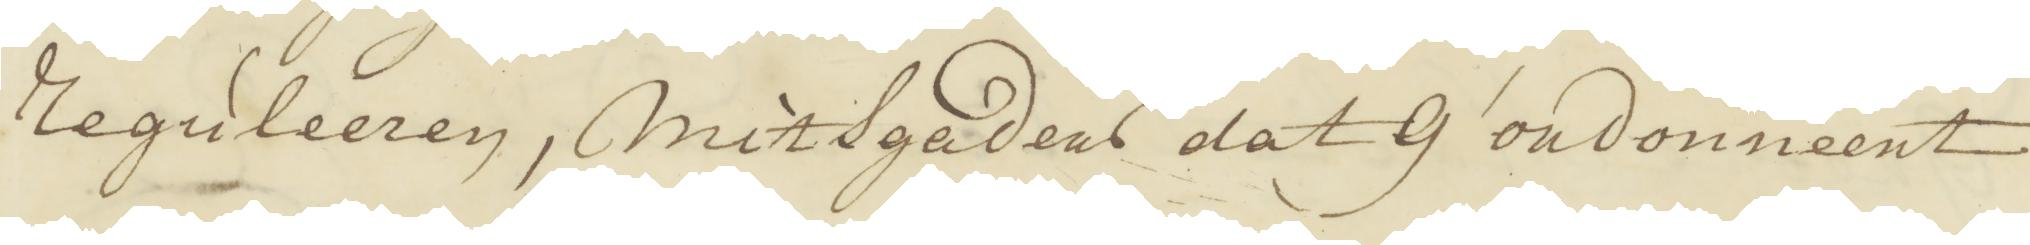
reguleeren, mitsgaders dat g’ordonneert
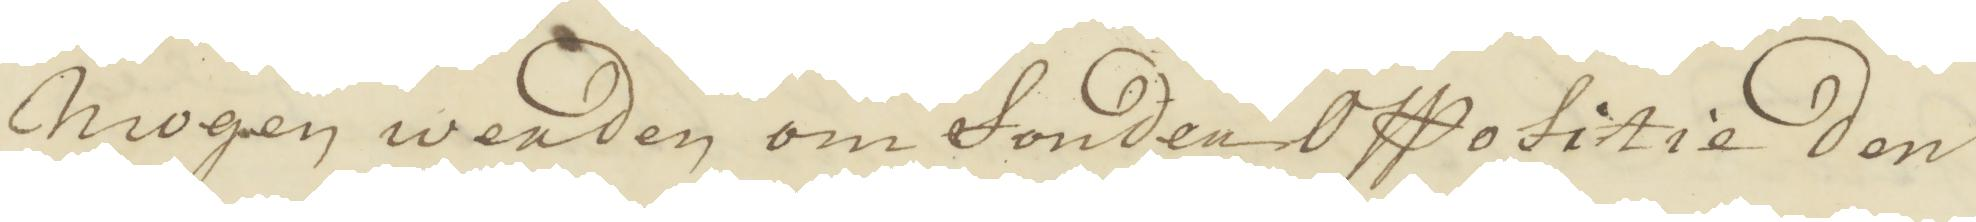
mogen werden om sonder oppositie den
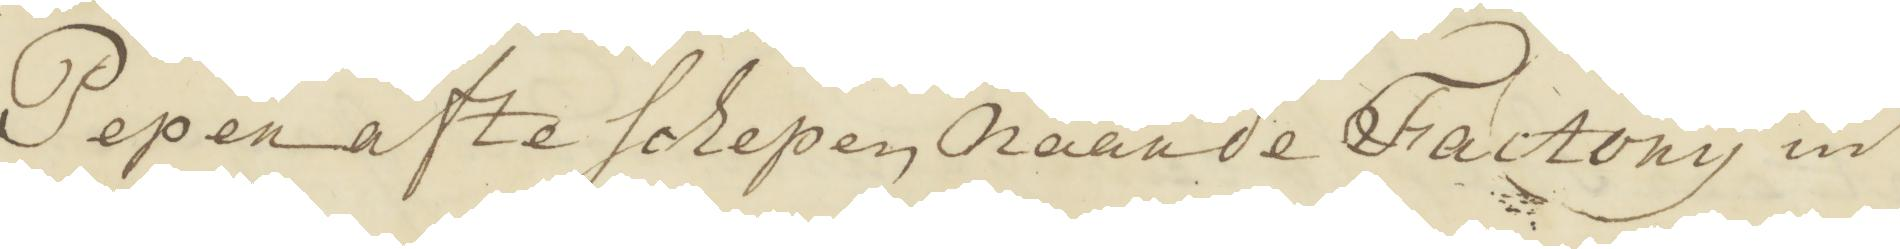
Peper afte schepen naar de Factorij in
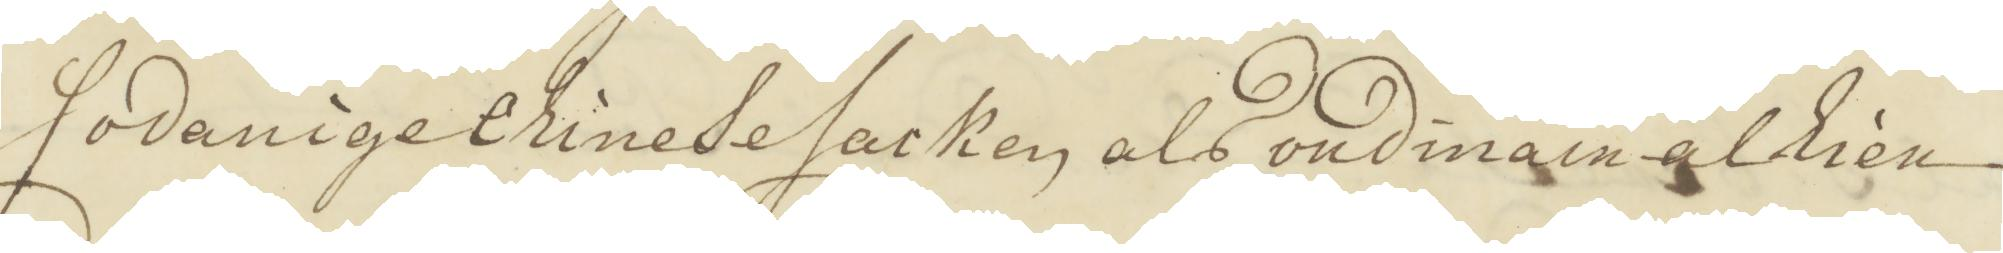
sodanige chinese sacken als ordinair alhier
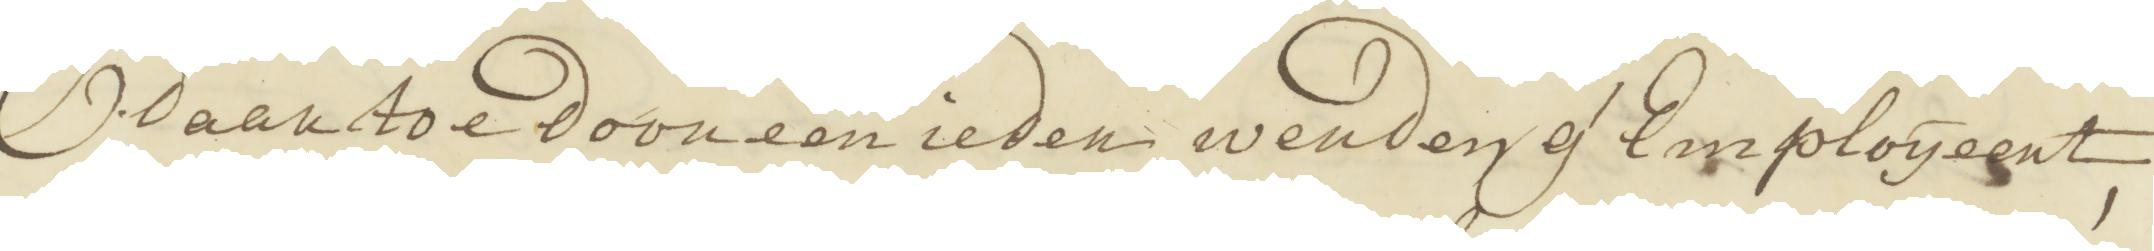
daar toe door een ieder werden g’Emploijeert,
